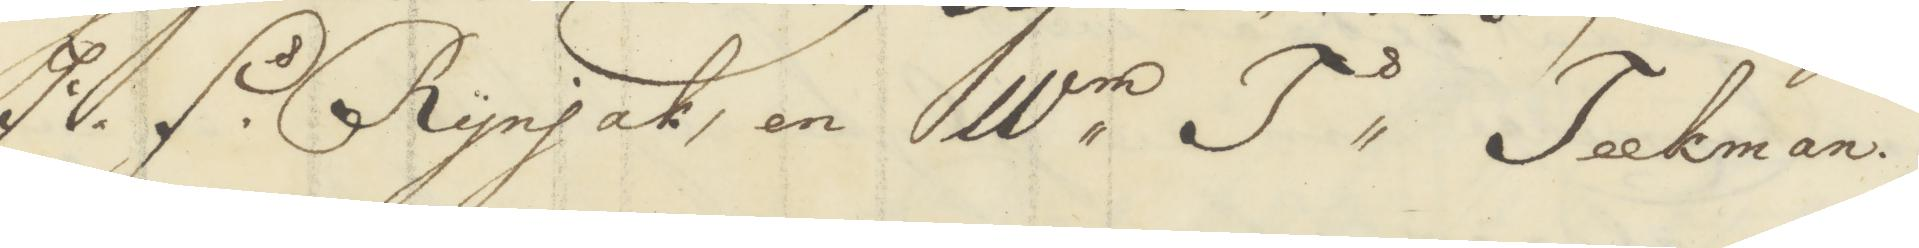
J.' F.s Rijnjak, en W„m T„s Teekman.
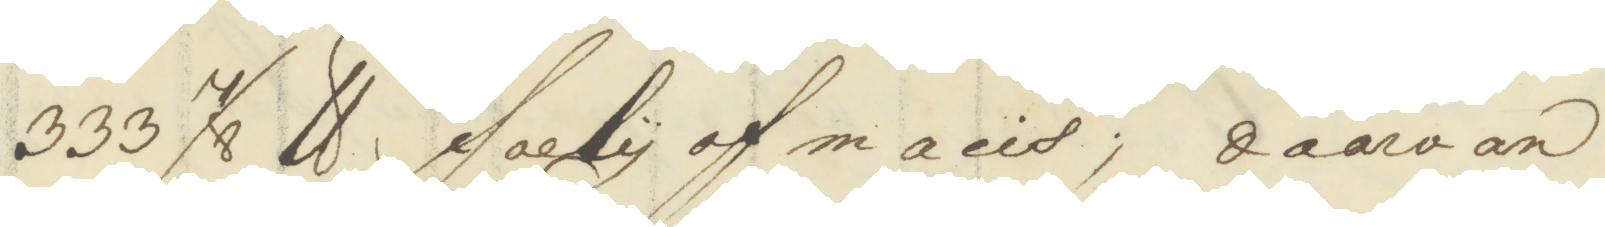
333 7/8 lb foelij of macis; daarvan
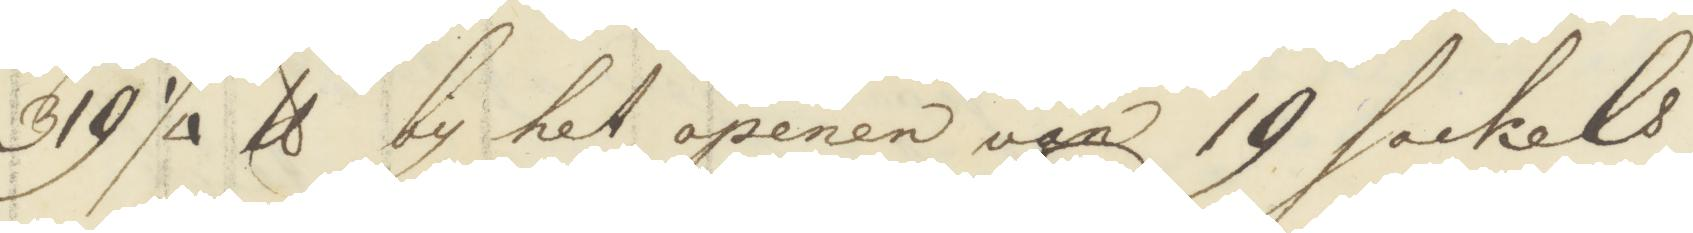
319¼ lb bij het openen van 19 sockels
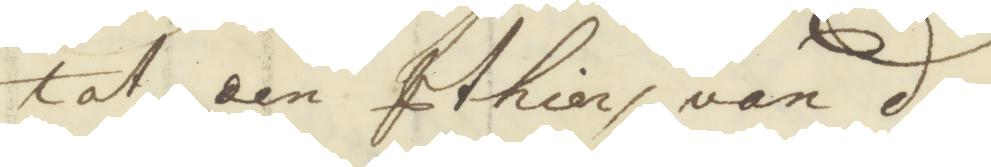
tot den verthier, van dese
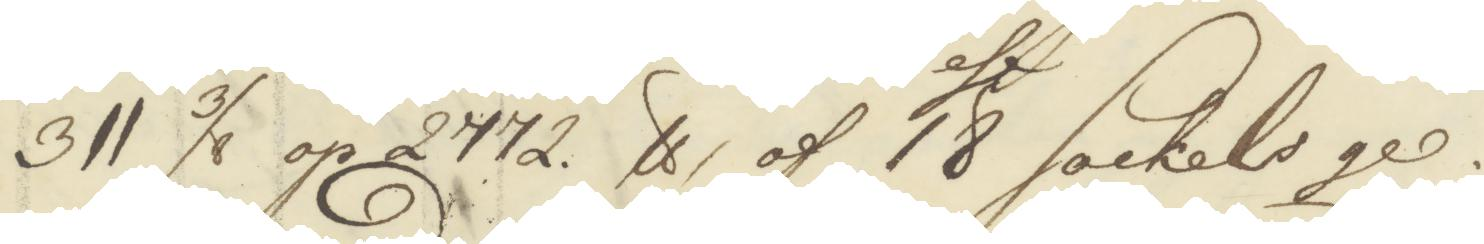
311 3/8 op 2772. lb, of 18 sockels ge
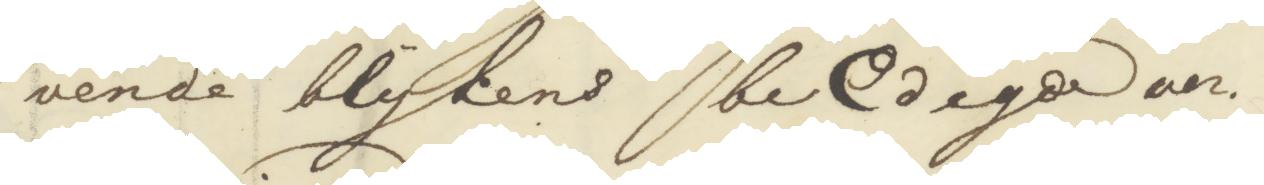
vende blijkens beedigde ver„
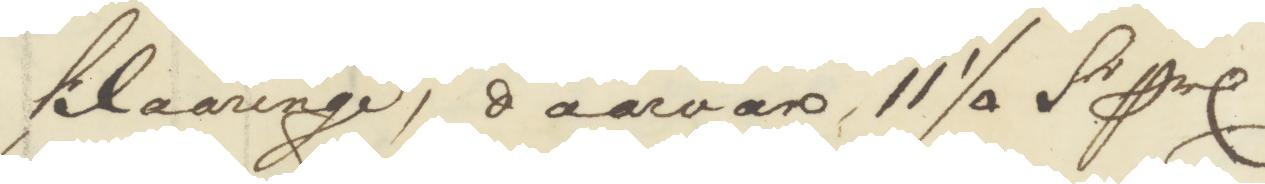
klaaringe, daarvan 11¼ sr prC
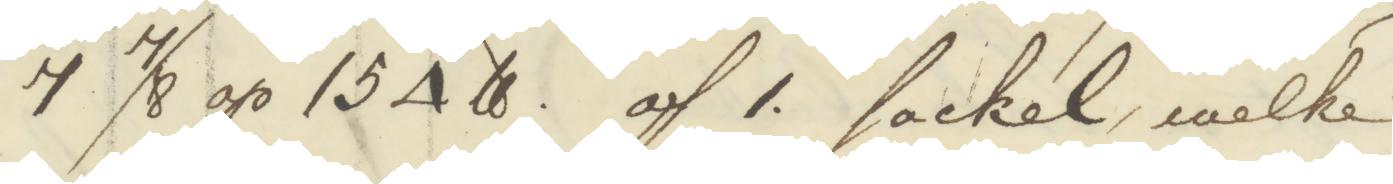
7 7/8 op 154 lb. of 1. sockel, welke
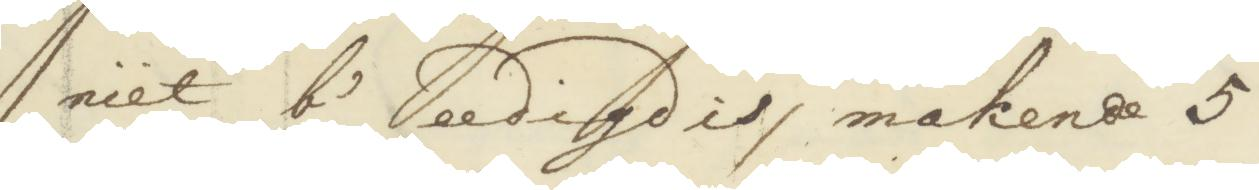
niet b'eedigd is, maken de 5
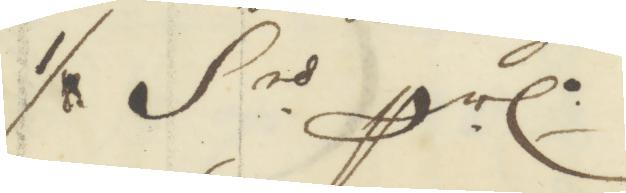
1/8 s.rs p.rC.o
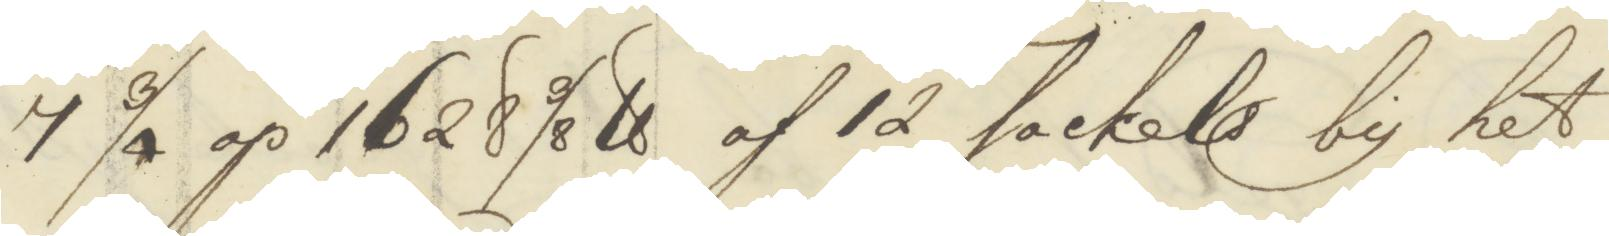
7 ¾ op 1628 3/8 lb of 12 sockels bij het
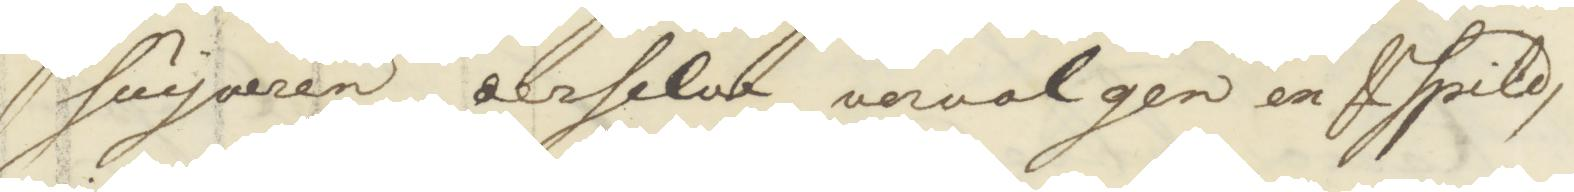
suijveren derselve vervolgen en verspild,
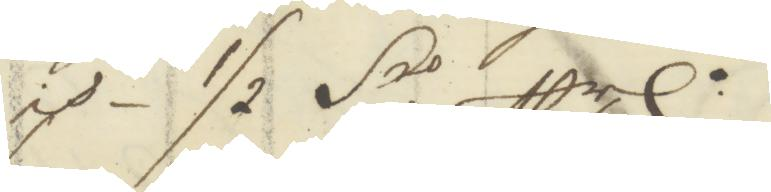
is — 1/2 s.rs prC.o
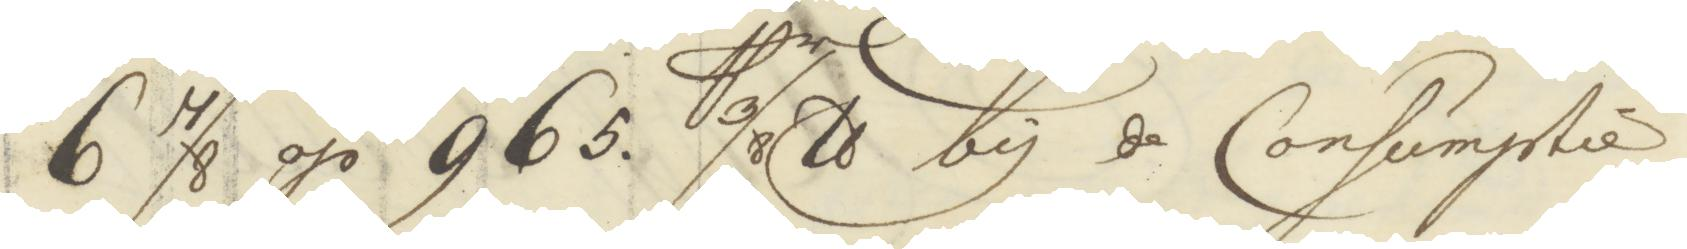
6 7/8 op 965. 3/8 lb bij de Consumptie
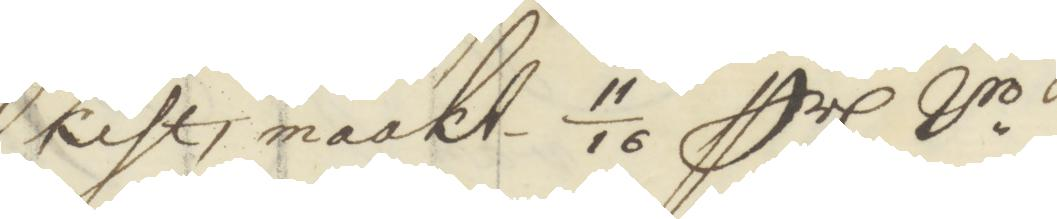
kist, maakt — 11/16 PrC r„n
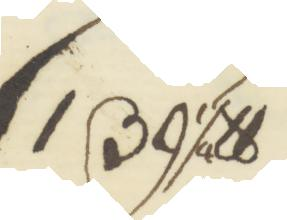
139¼ lb
